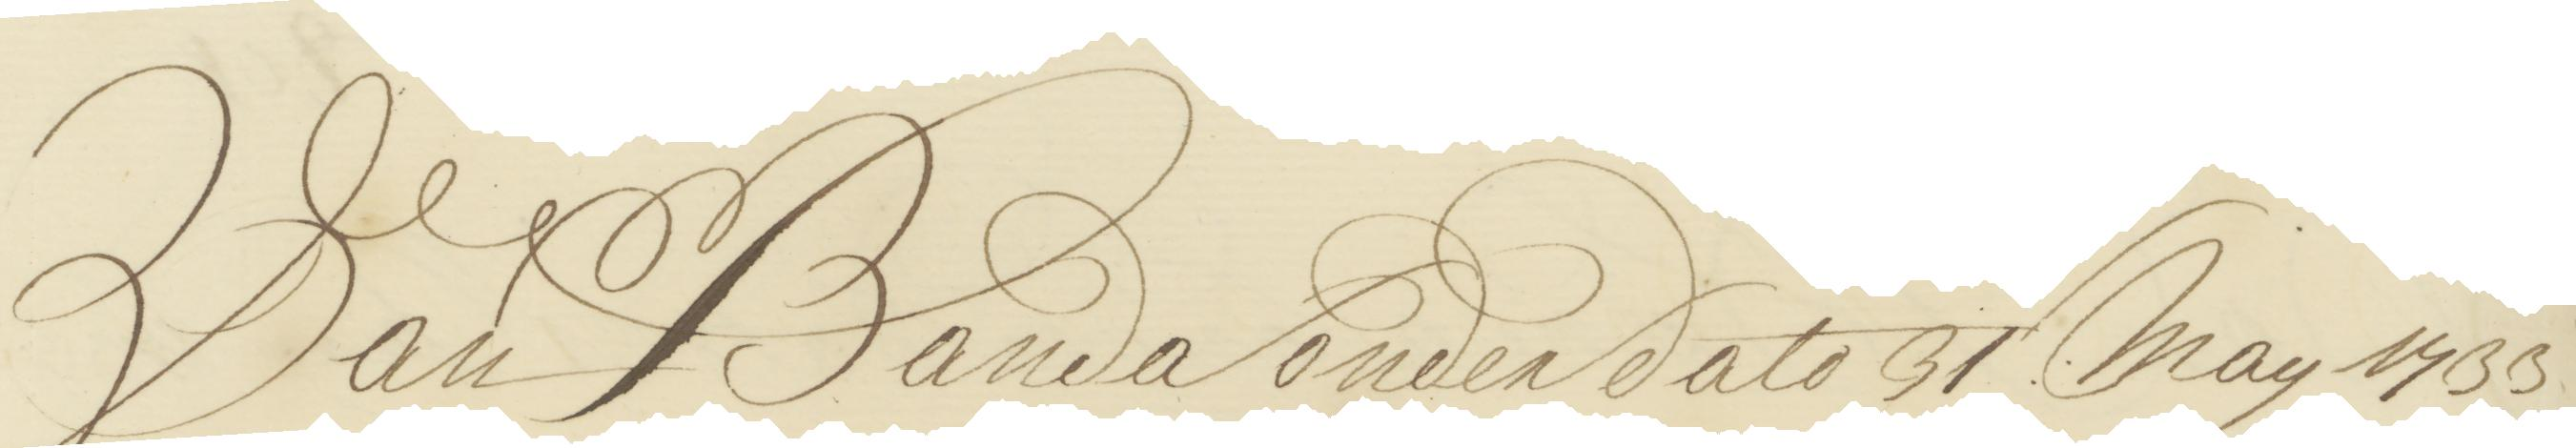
Van Banda onder dato 31: May 1733
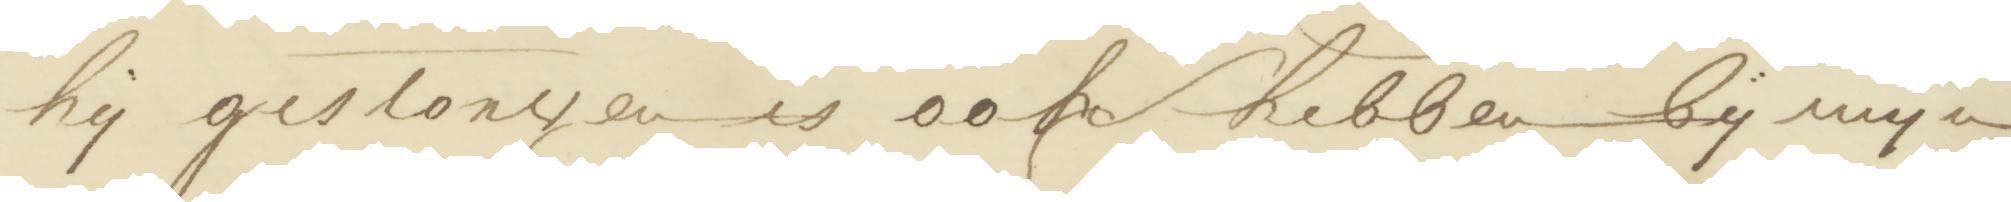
hij gestorven is ook hebben bij mijn
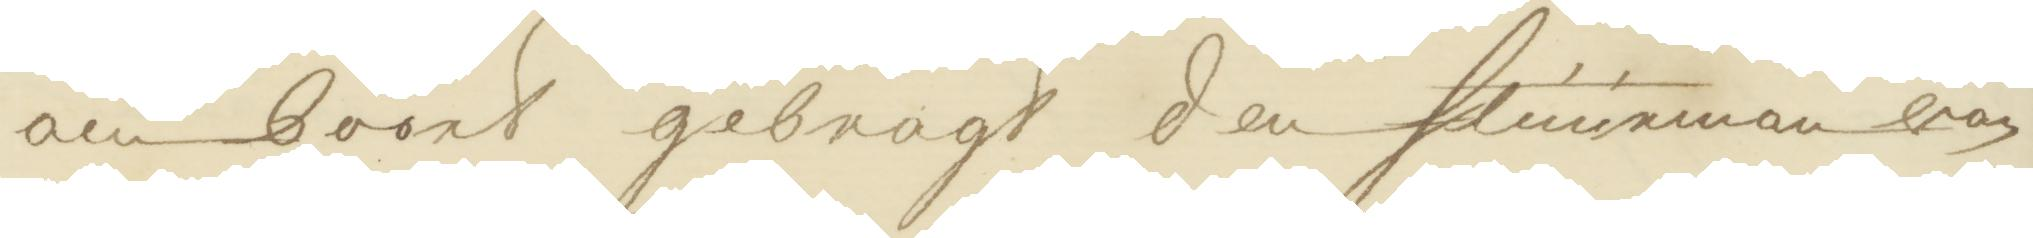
aen boort gebragt den stuurman van
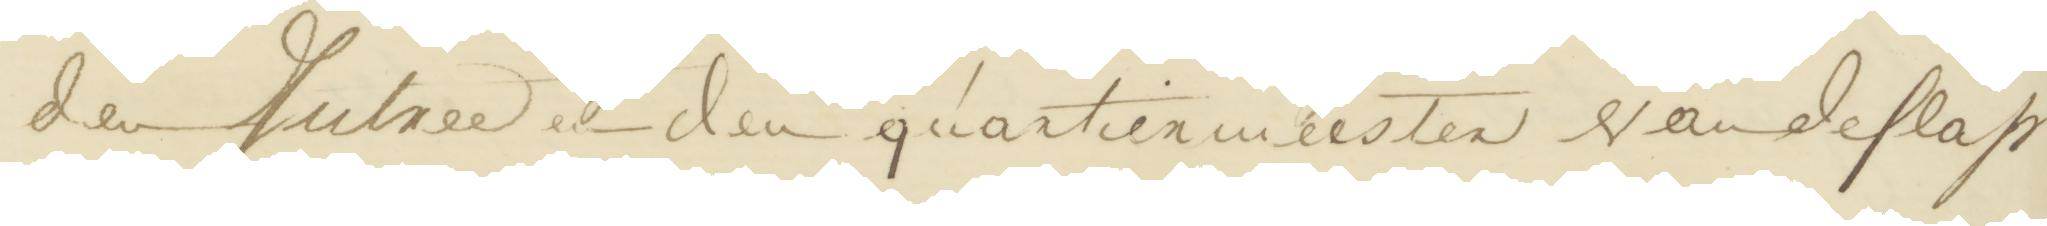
den Jntree en den quartier meester van de flap
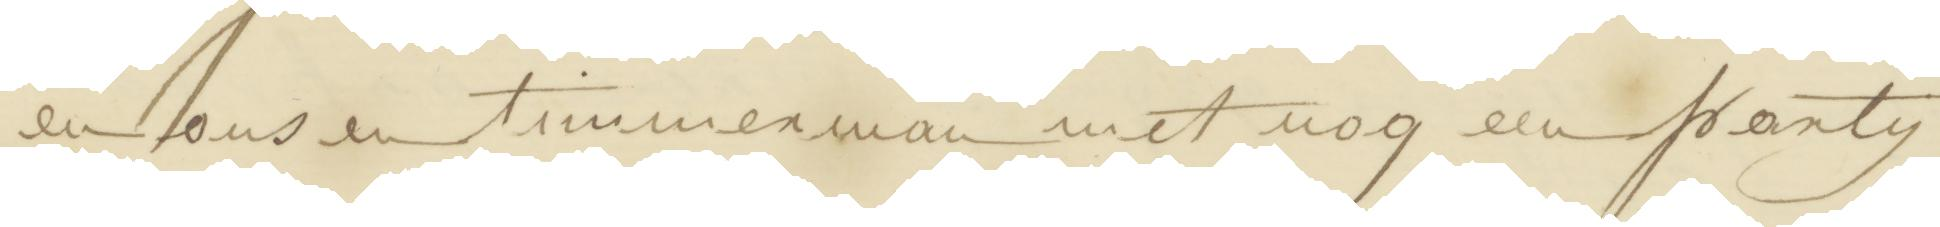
en onsen timmerman met nog een partij
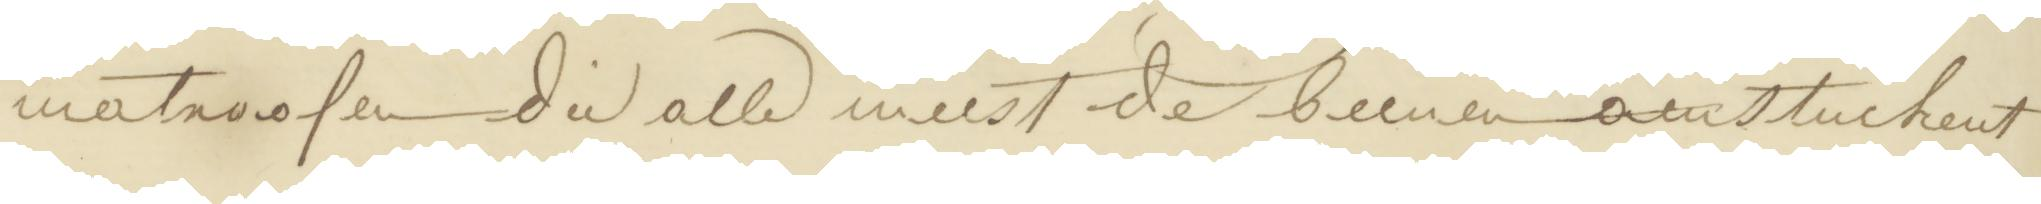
matroosen die alle meest de beenen aen stuckent
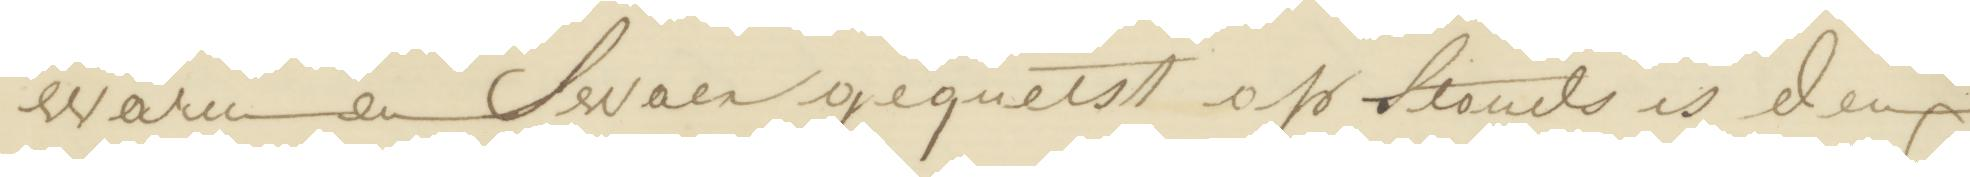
waren en Swaer gequetst op Stonds is den
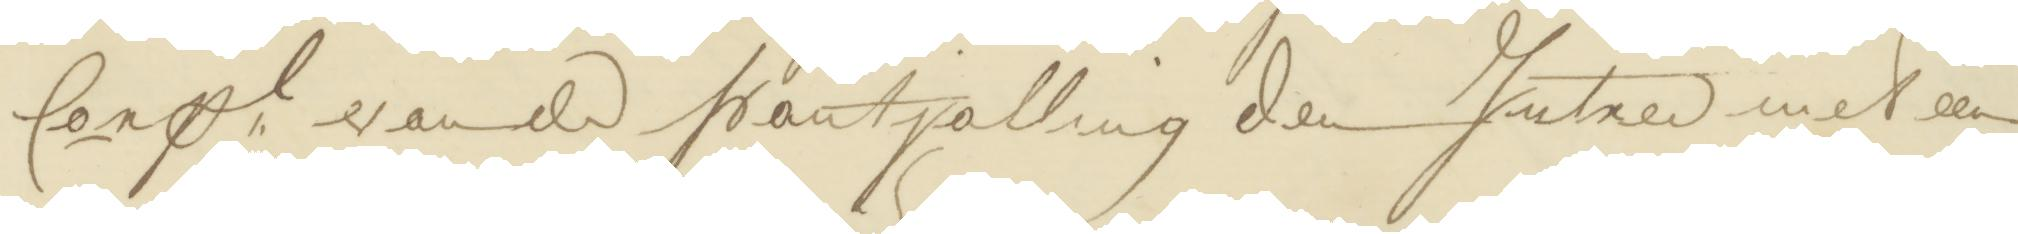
Corp„l van de pantjalling den Jntree met een
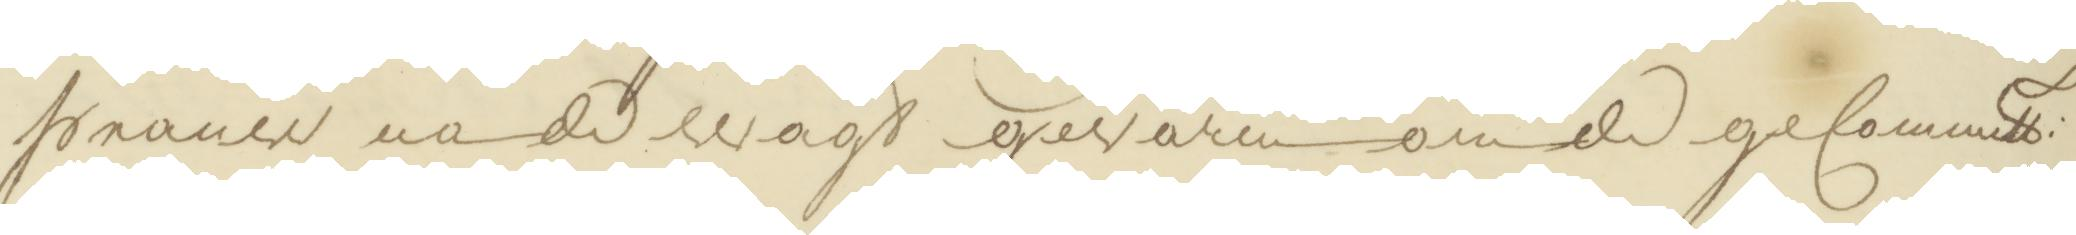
prauw na de wagt gevaren om de gecommitt:s
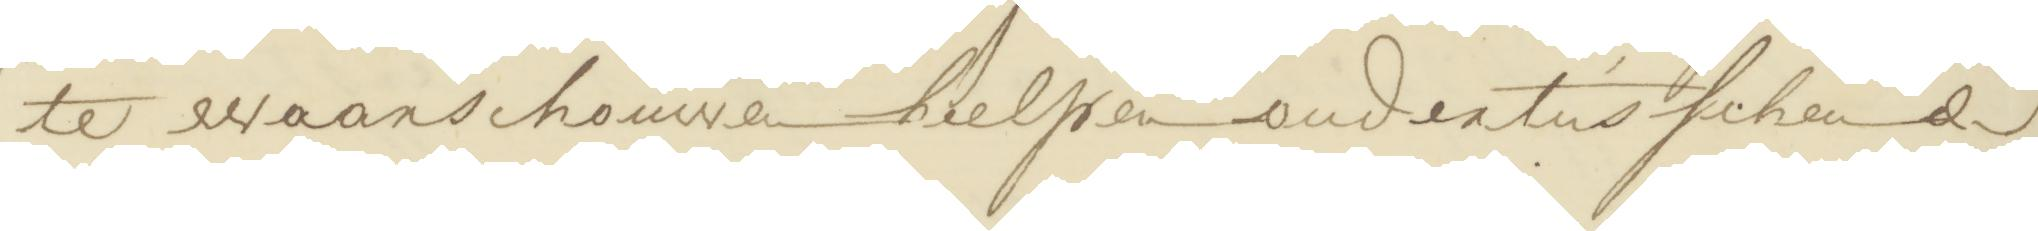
te waarschouwen hielpen ondertusschen de
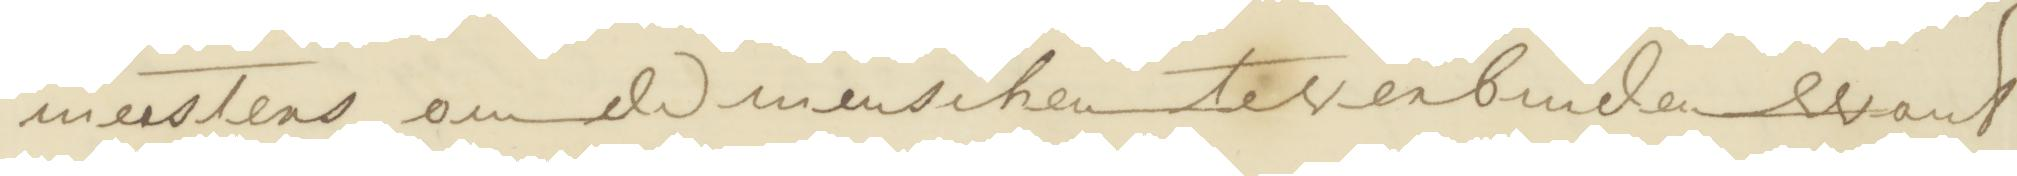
meesters om de menschen te verbinden want
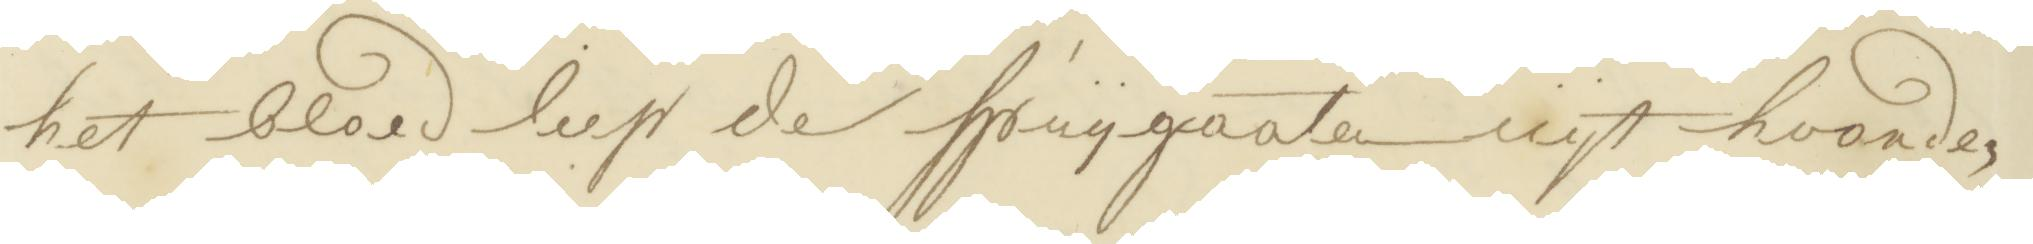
het bloed liep de spuijgaaten uijt hoorden
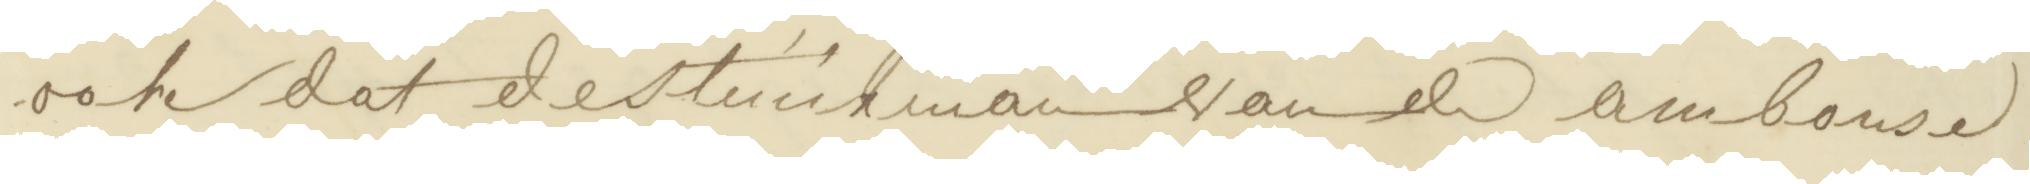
ook dat de stuurman van de ambonse
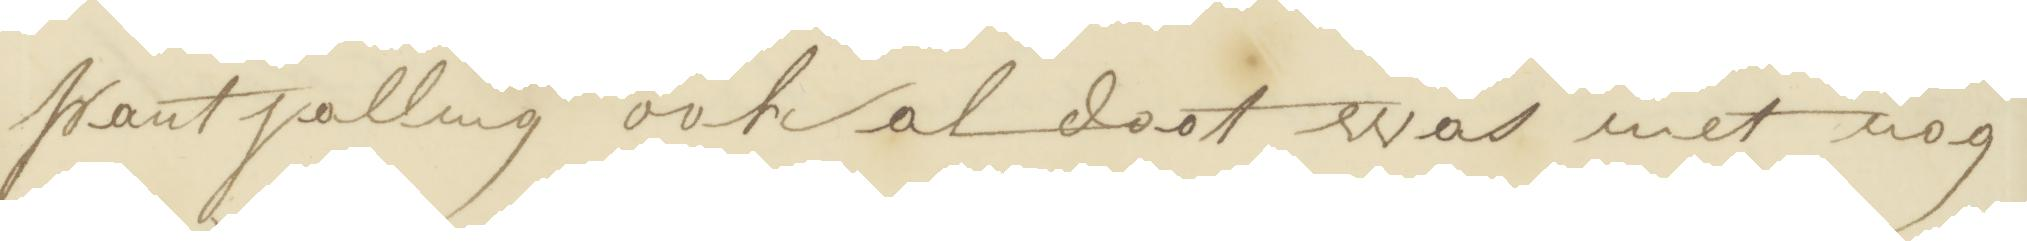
pantjalling ook al doot was met nog
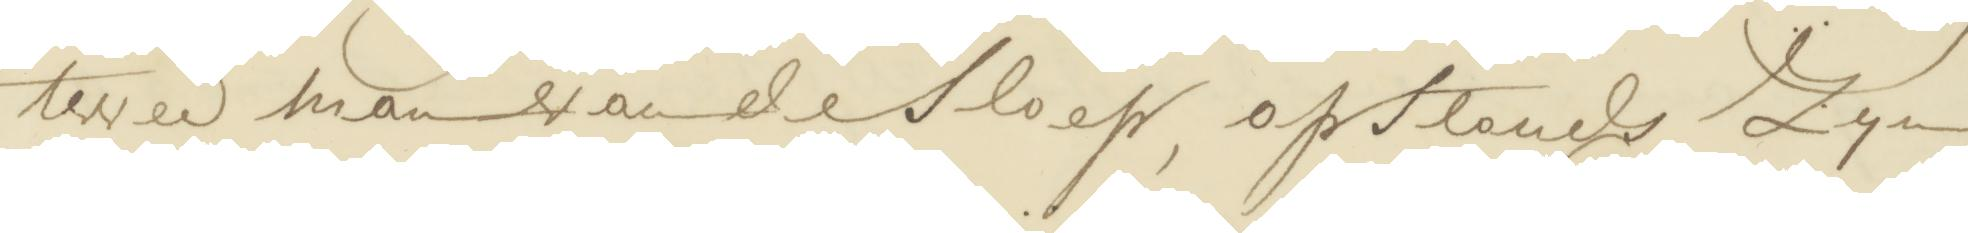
twee man van de Sloep, opstonds Zyn
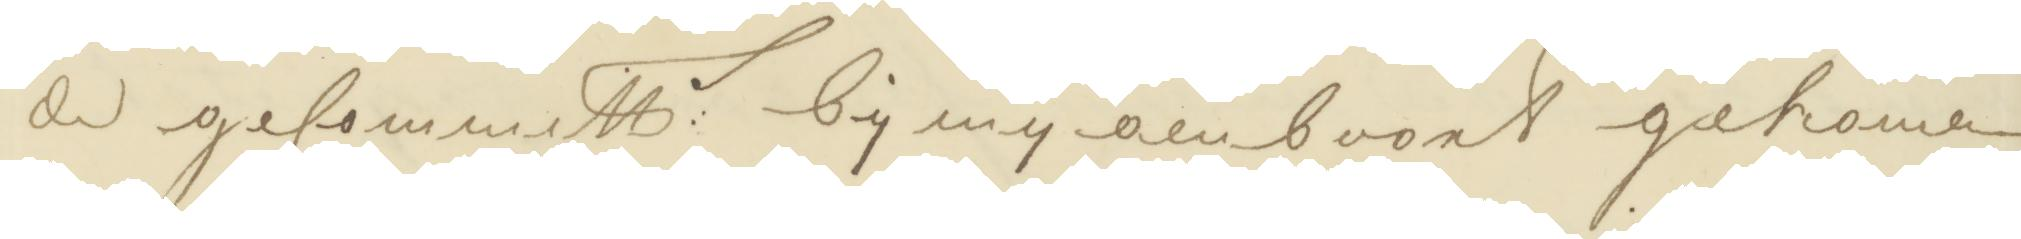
de gecommitt:s bij mij aen boort gekomen
